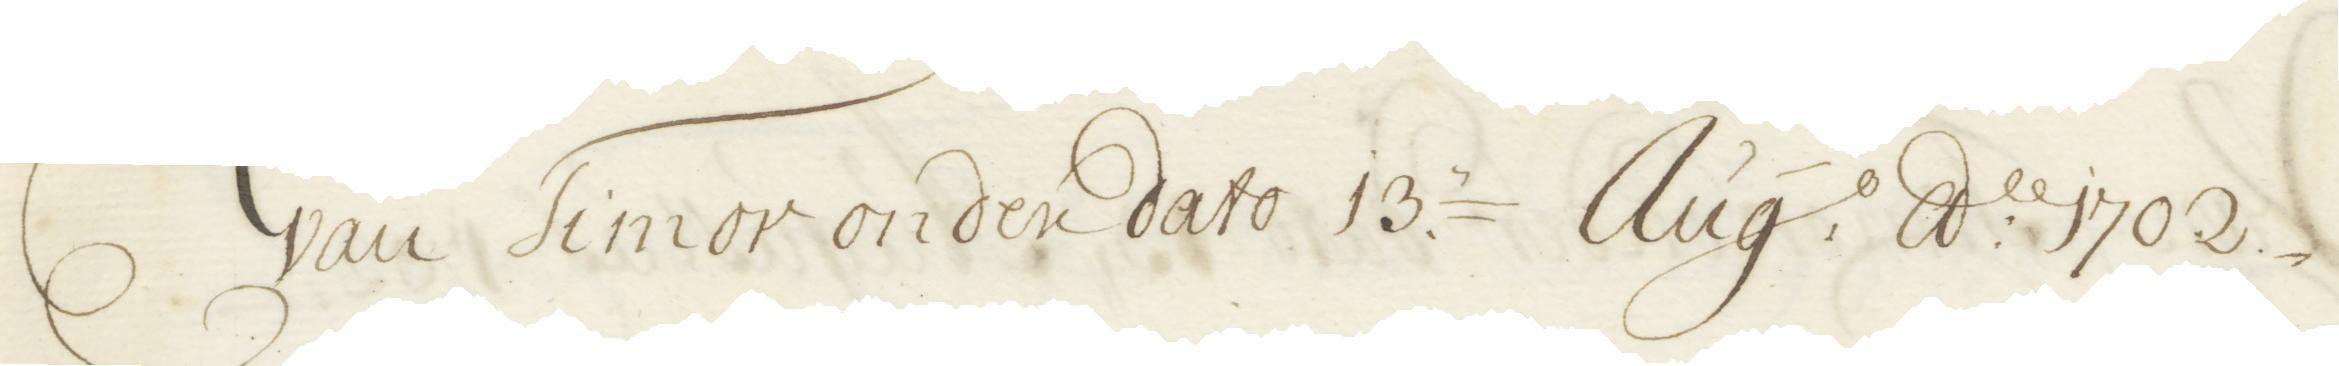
van Timor onder dato 13=' Aug:o A:o 1702:-
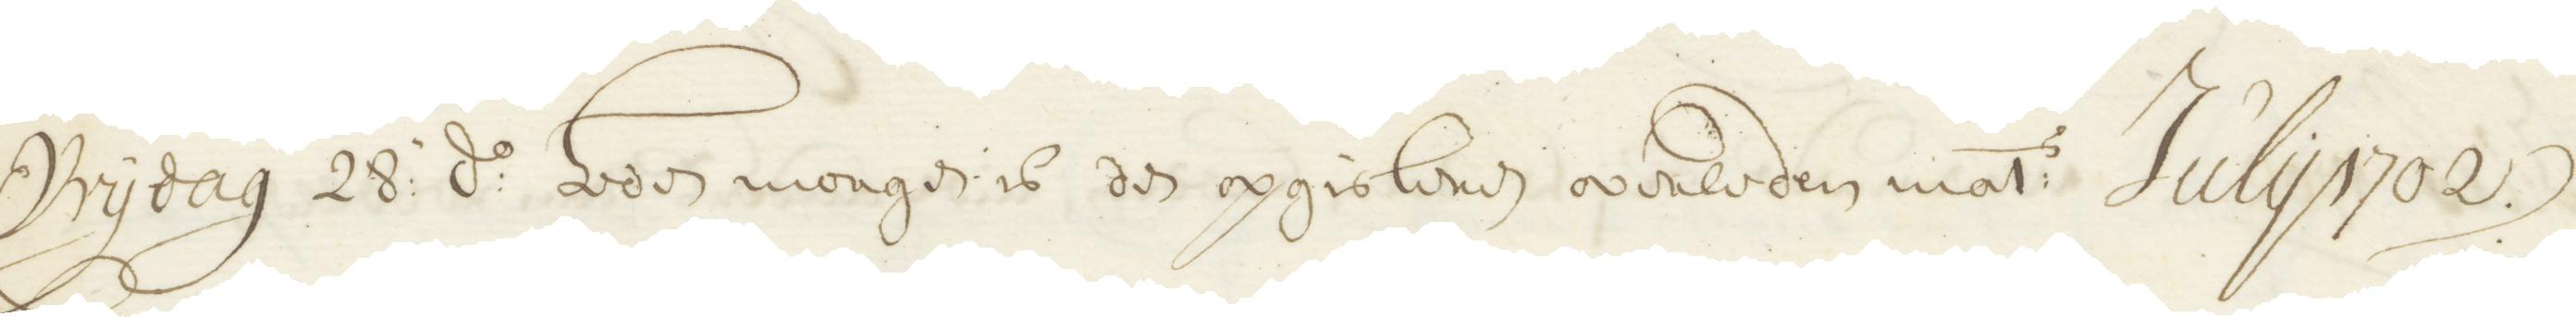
Vrijdag 28: d:o heden morgen is den op gisteren overleden mat:s Iulij1702./.
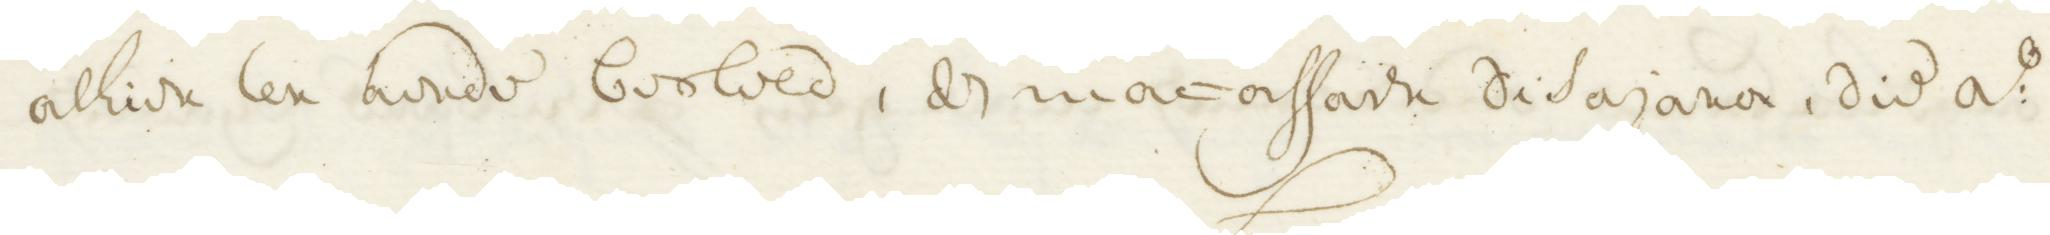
alhier ter aerde besteld, den macassaer disajare, die a:o
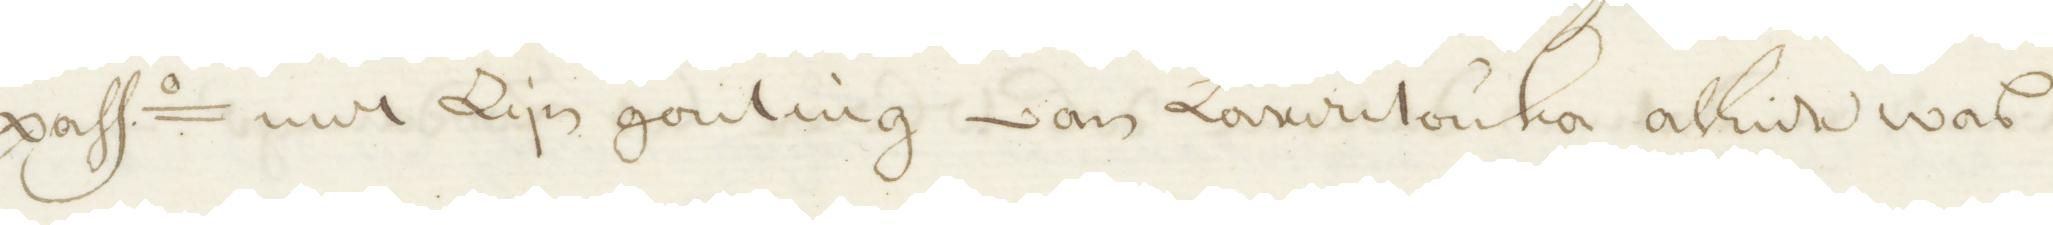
pass=o met zijn gouting van Lorentouka alhier was
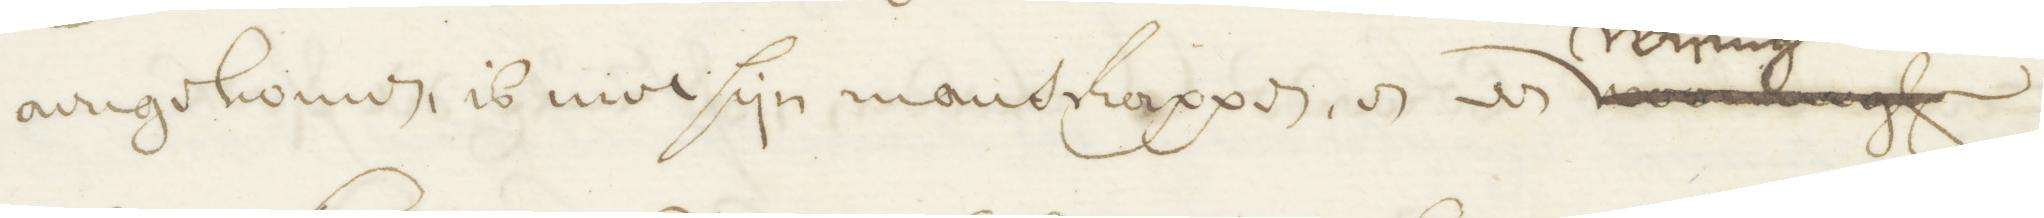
aengekomen, is met sijn manschappen,en een weinigh
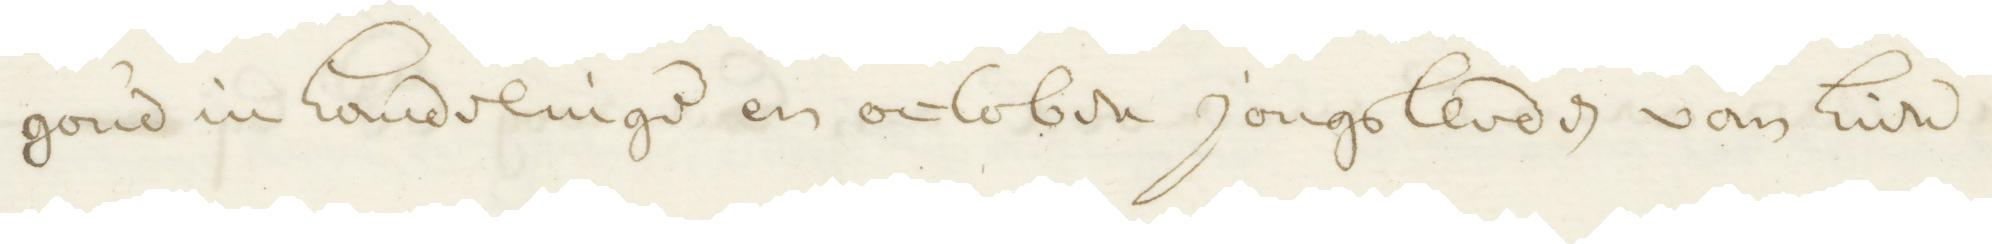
goud in handelinge en october jongstleden van hier
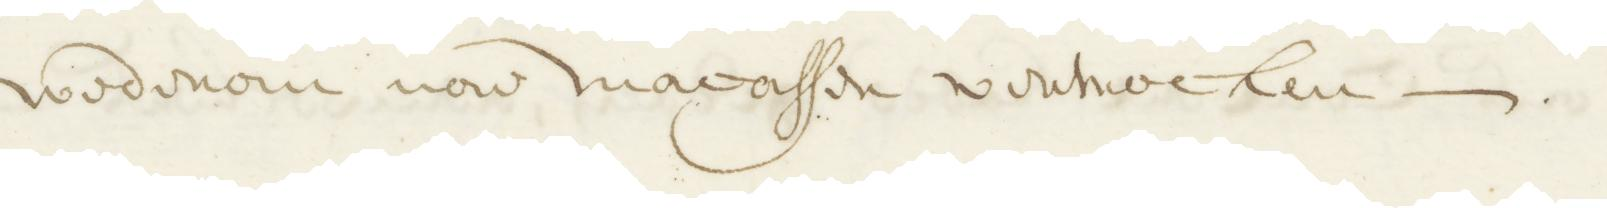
wederom nae macasser vertrocken —.
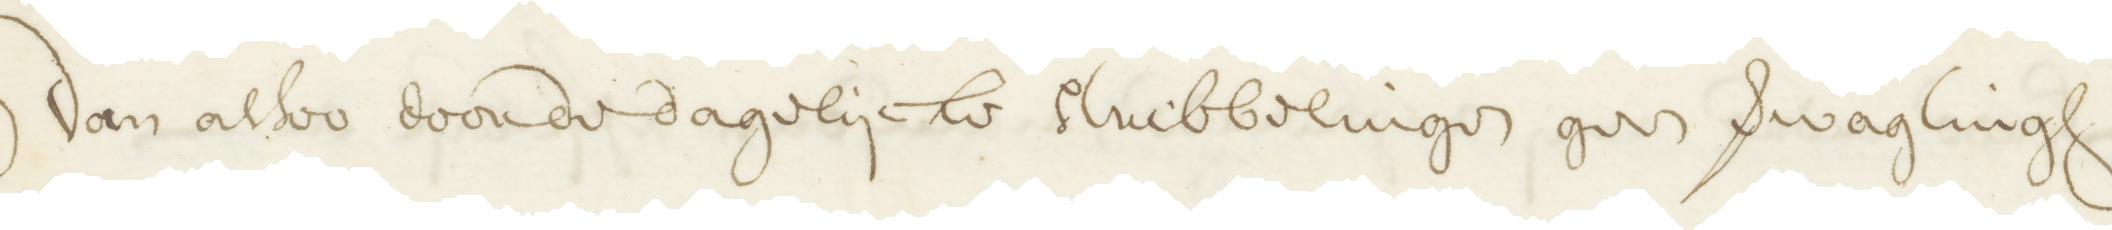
Van alsoo door de dagelijcke stribbelingen geen verwagtingh
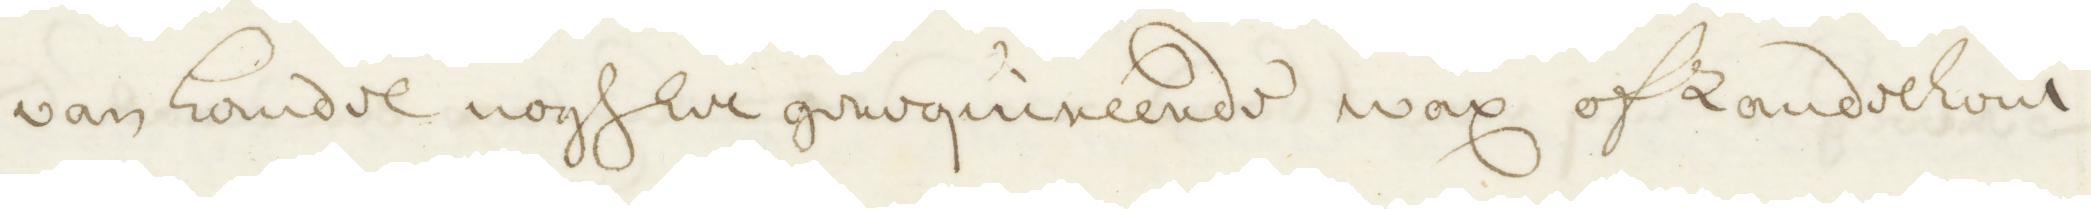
van handel nogh het gerequireerde wax of zandelhout
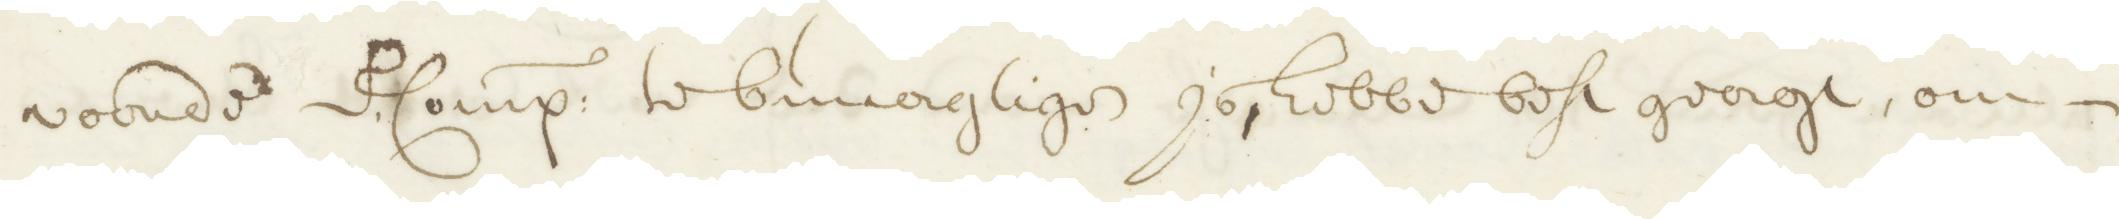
voorde E.Comp: te bumagtigen js, hebbe best geagt, om
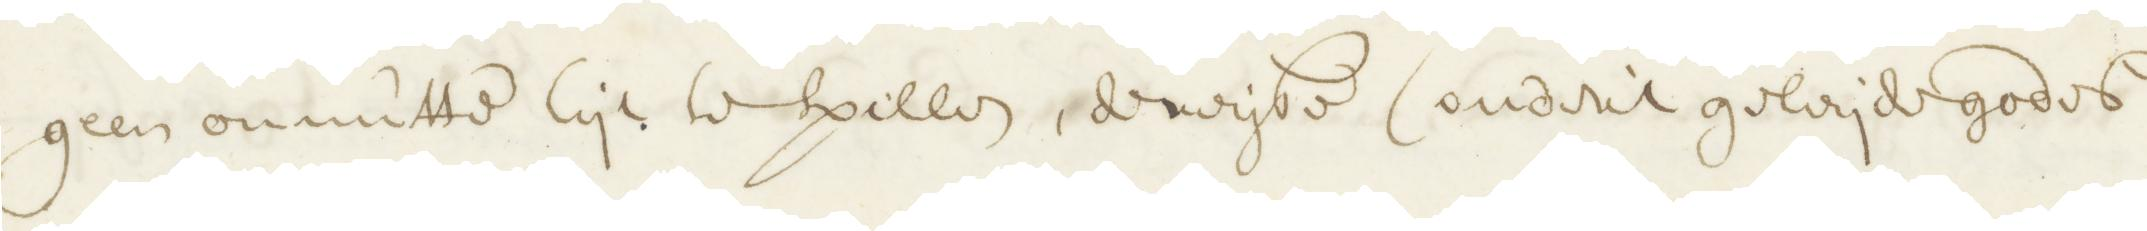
geen onnutte tijt te spillen, dereijse (onder't geleijde godes
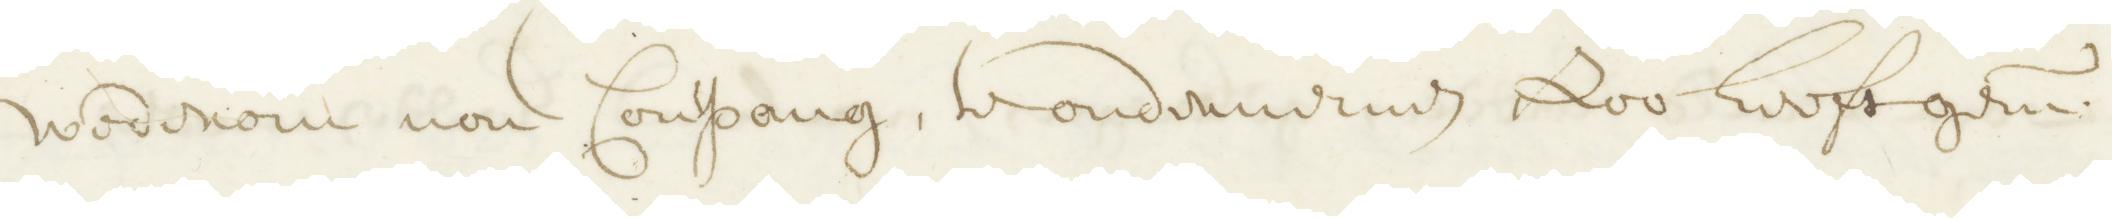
wederom van Coupang, te ondernemen zoo heeft gem:
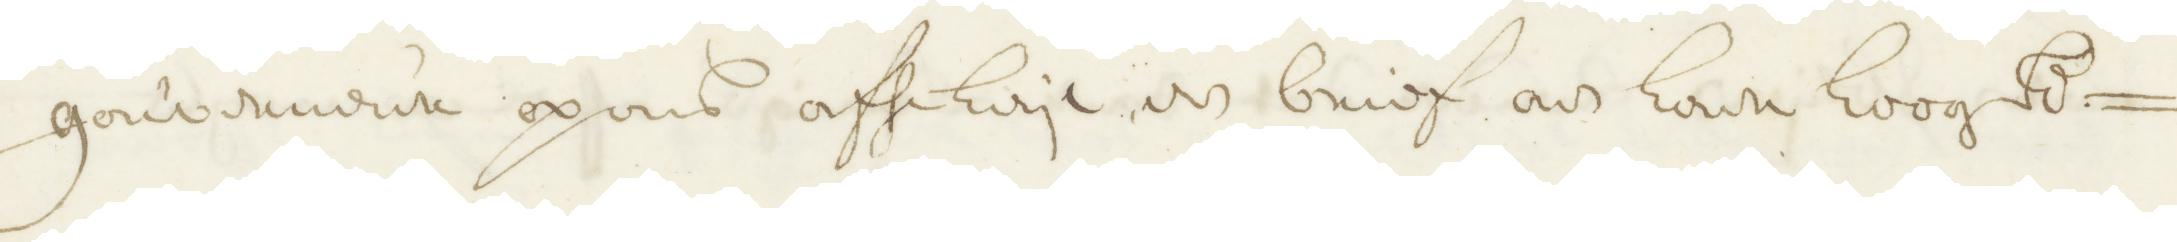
gouverneur opons afscheijt, een brief aen heer hoog Ed=
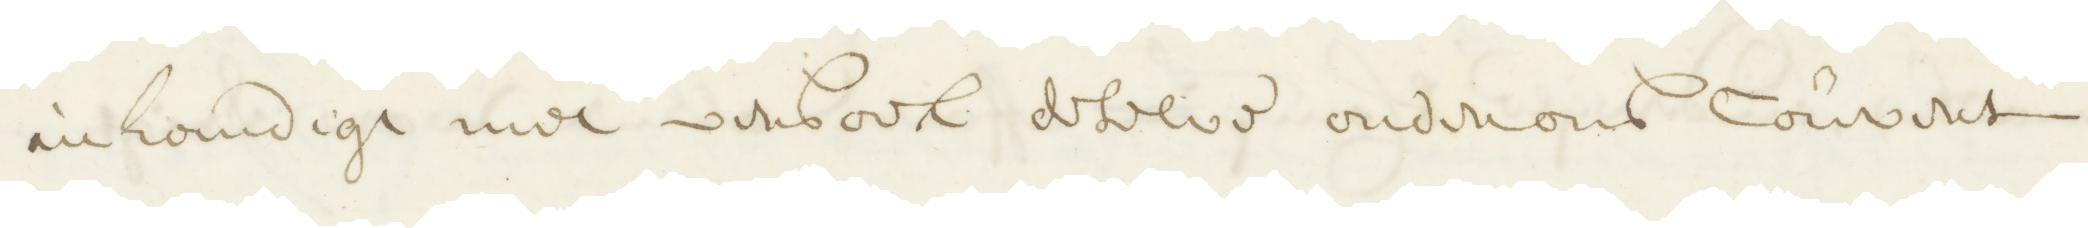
inhandigt met versoek deselve onder ons couvert
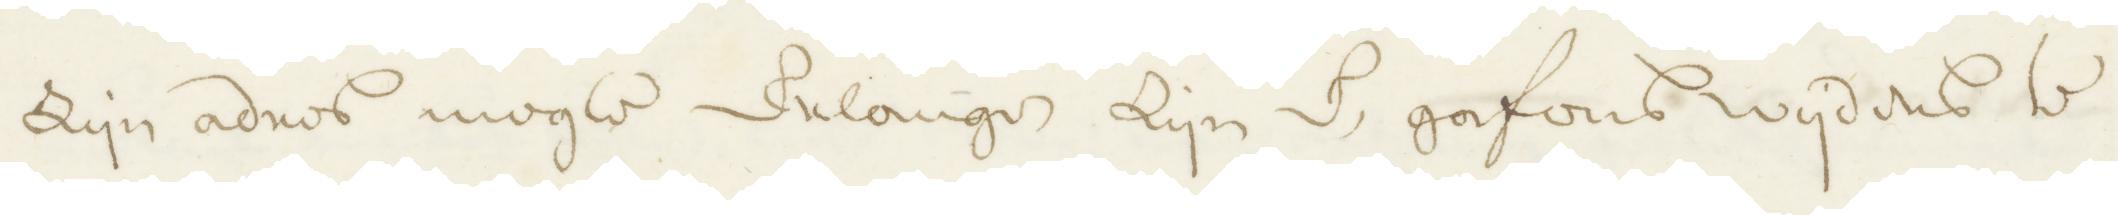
zijn adres mogte Erlangen zijn E„ gafons wijders te
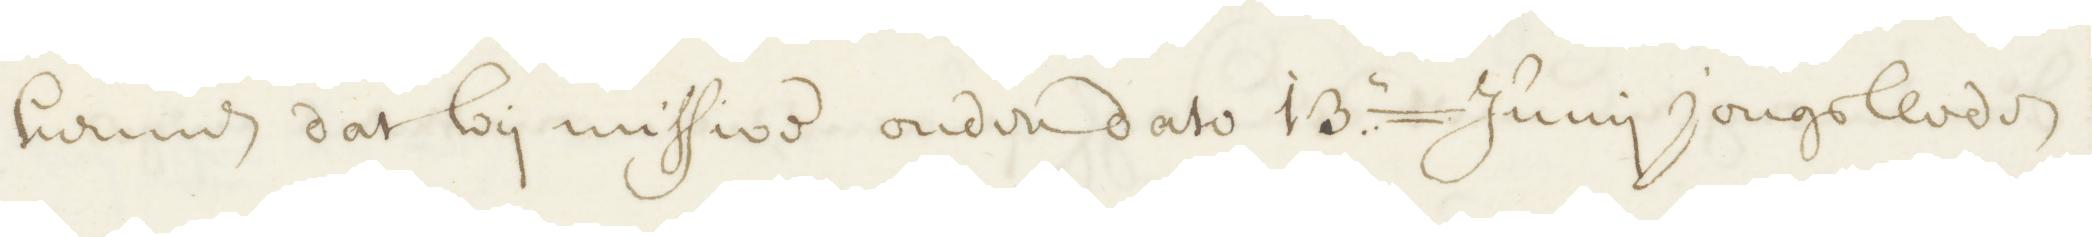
kennen dat bij missive onder dato 13:en Junij jongstleden
